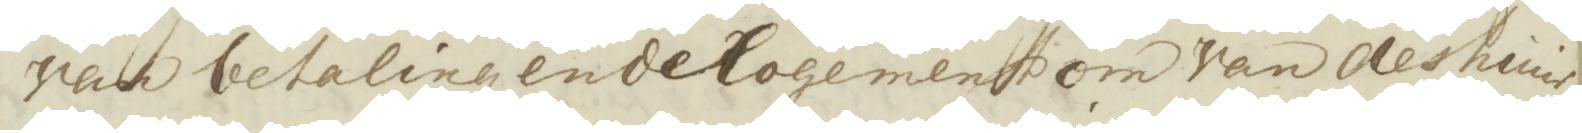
van betaling en de logement om van des huur
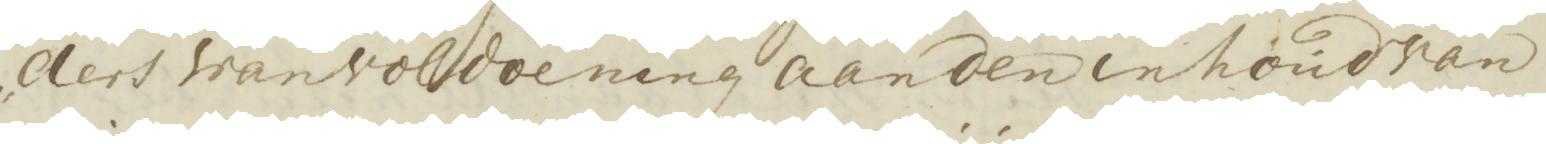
„ders van voldoening aan den inhoud van
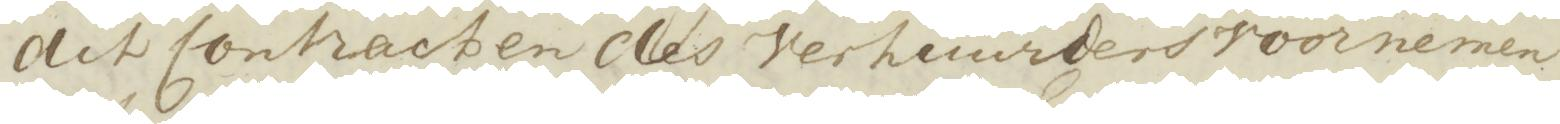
dit Contract en des verhuurders voornemen
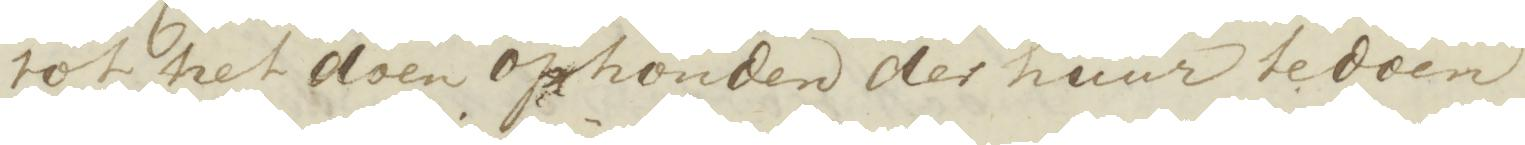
tot het doen ophouden der huur te doen
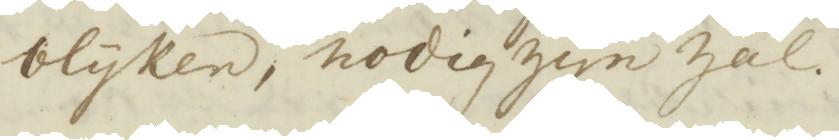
blijken, nodig zijn zal.
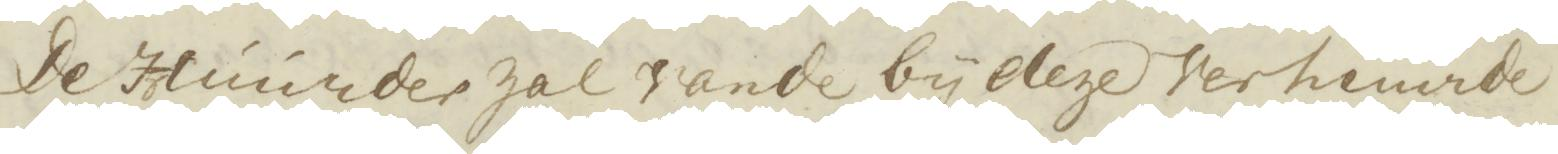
De Huurder zal vande bij deze verhuurde
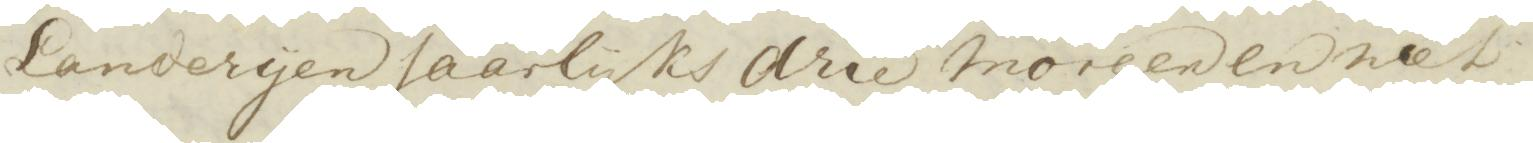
Landerijen Jaarlijks drie morgen en niet
